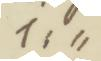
1: „
